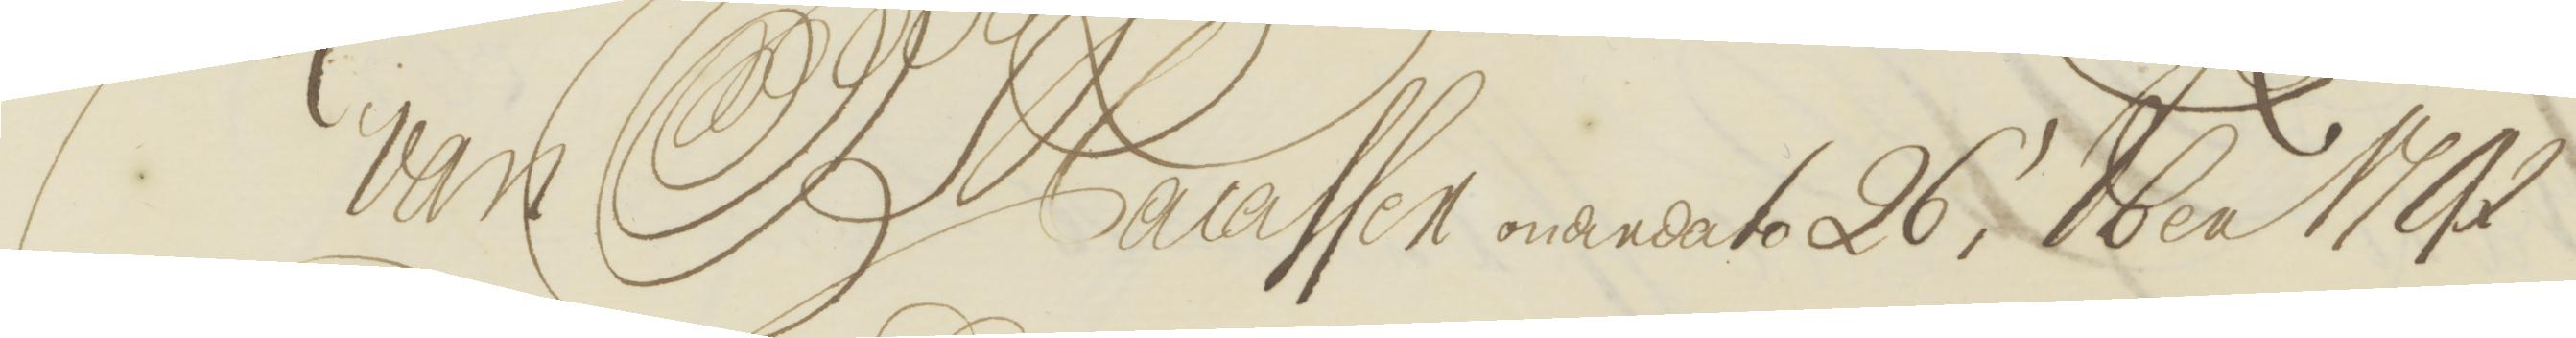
Van Macasser onder dato 26,' 8ber 1742
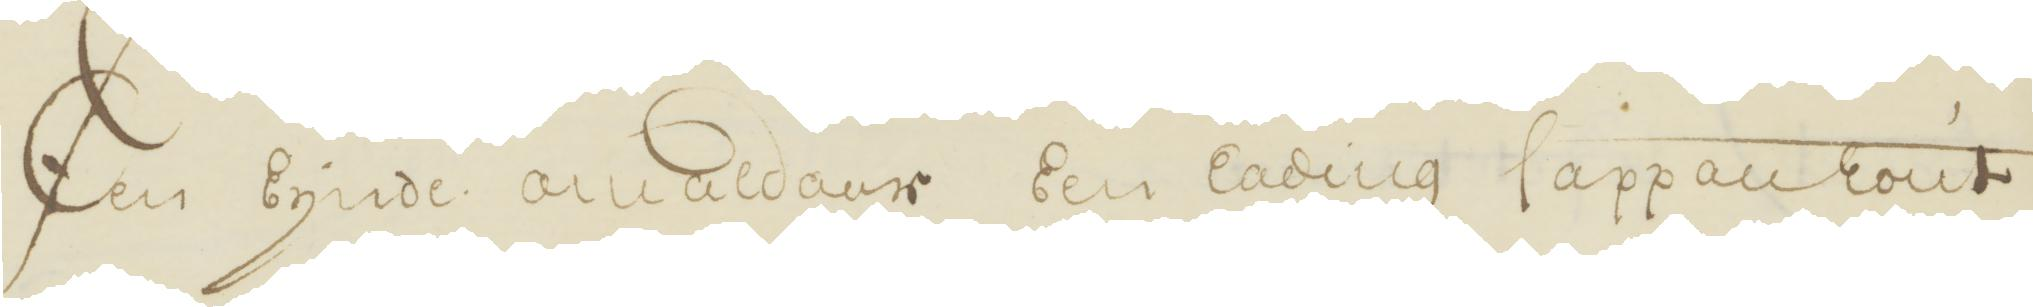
Ten Eijnde om aldaar Een lading sappanhout
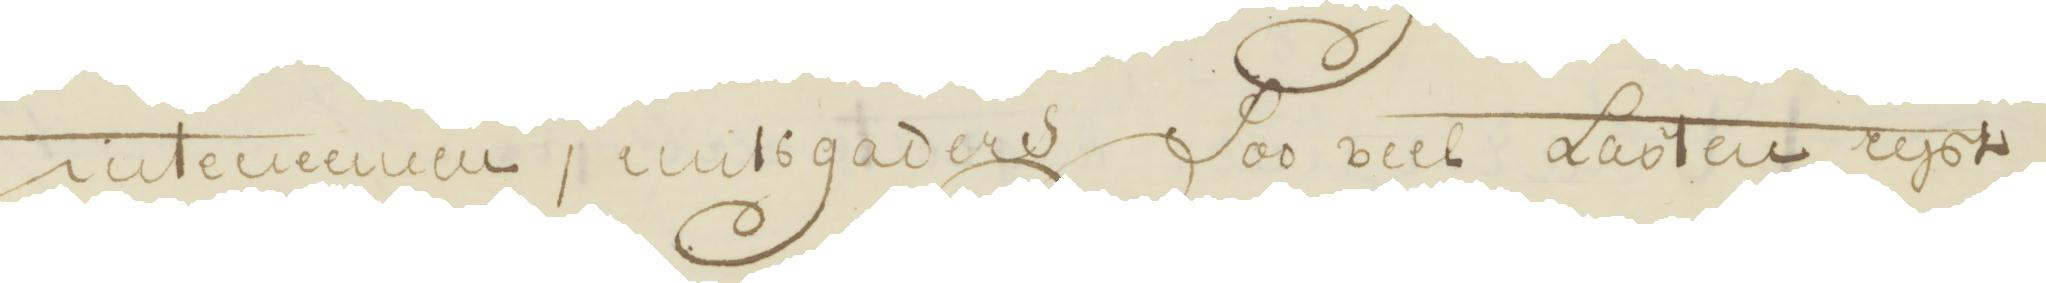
inteneemen, mitsgaders soo veel lasten ryst
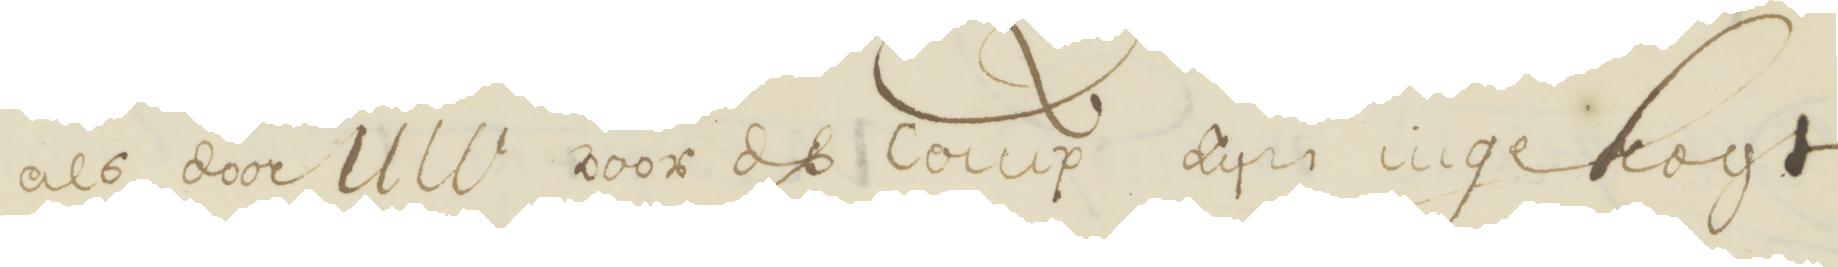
als door UW voor dE Comp' zyn ingekogt
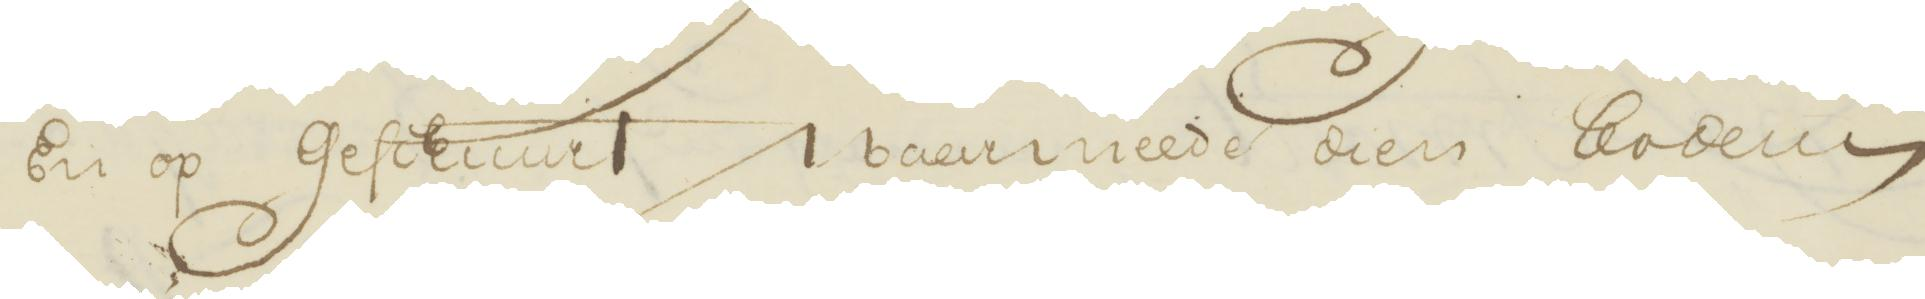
En op geschuurt waarmeede dien bodem
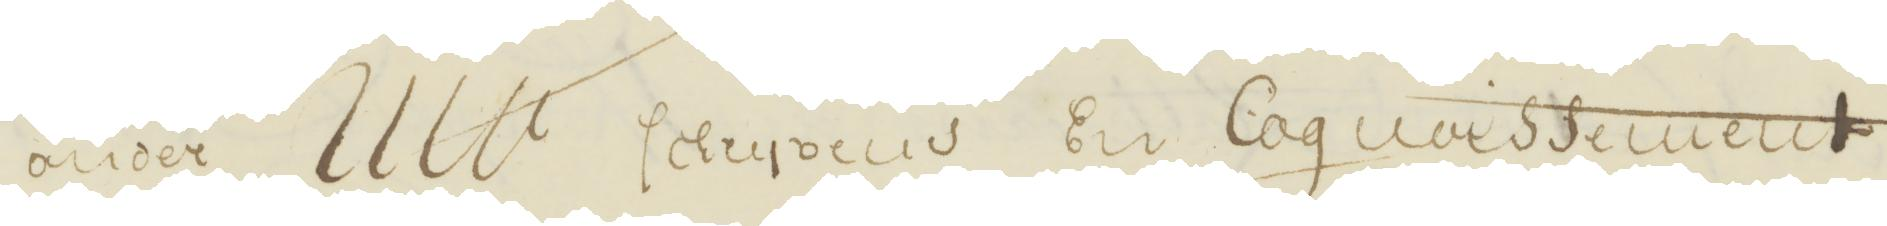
onder UW schryvens En Cognoissement
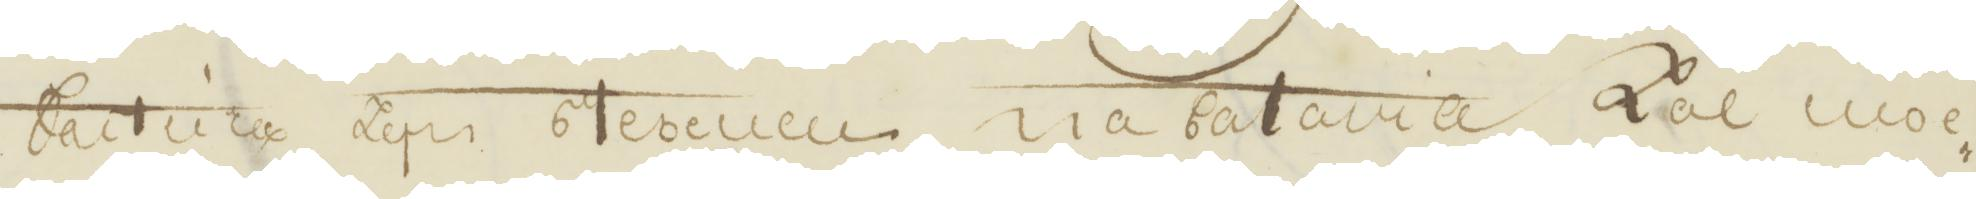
facture zyn stevenen na batavia zal moe„
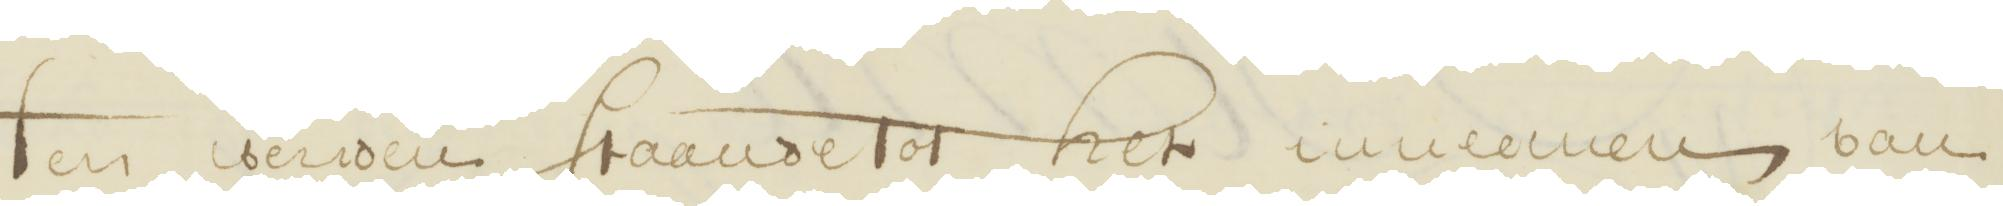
ten wenden staande tot het inneemen van
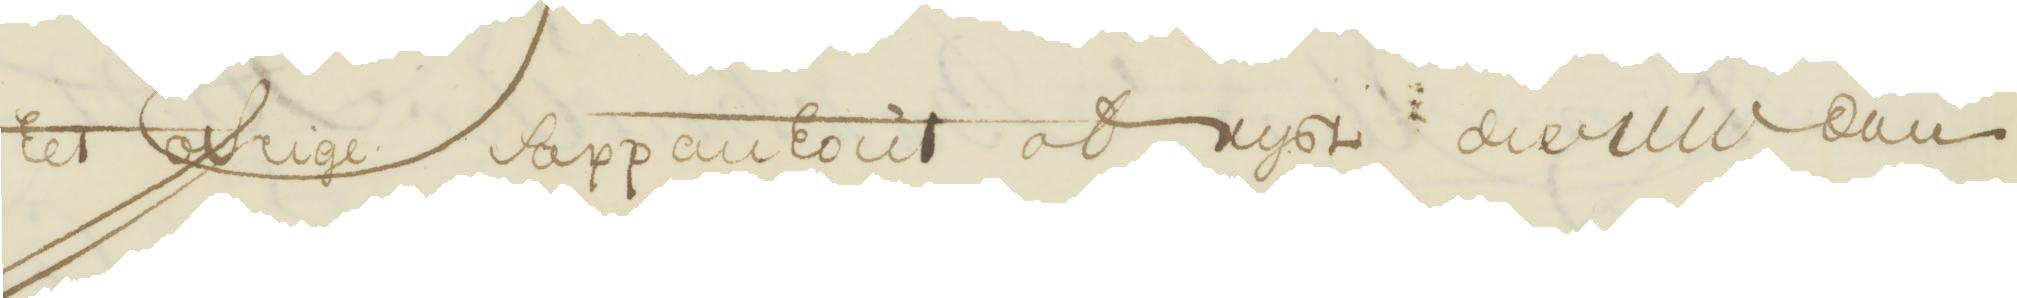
het overrige sappanhout of ryst die UW dan
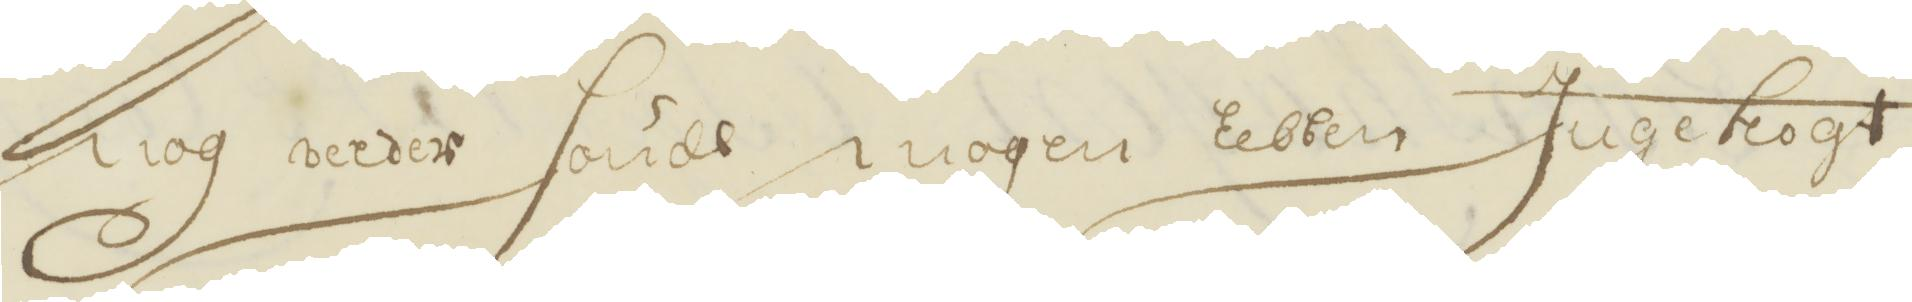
nog verder soude mogen hebben Jngekogt
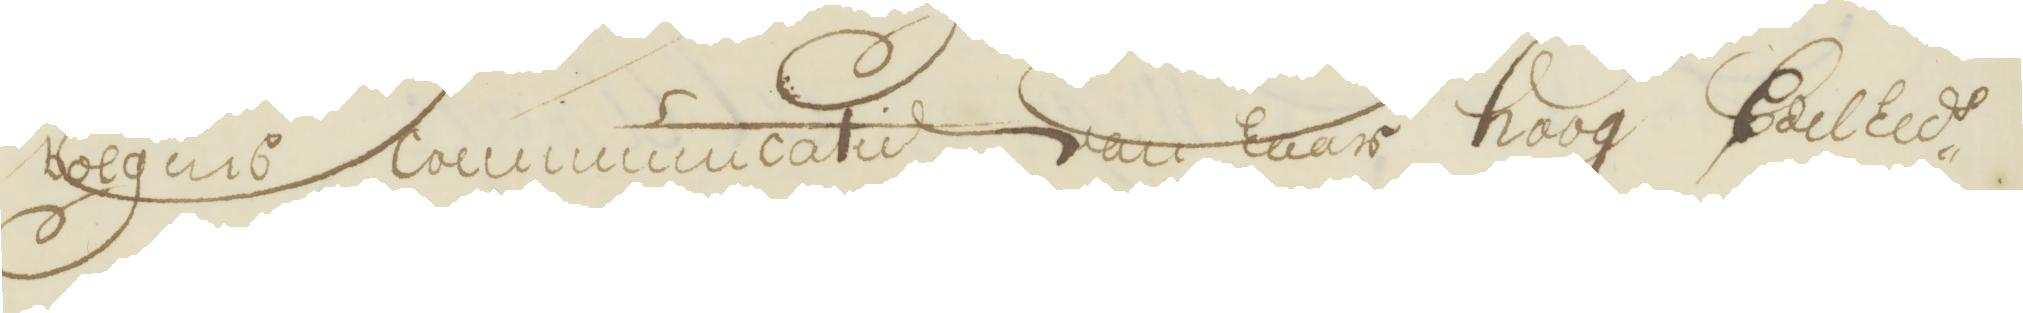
volgens communicatie van haar hoog Edelhed„s
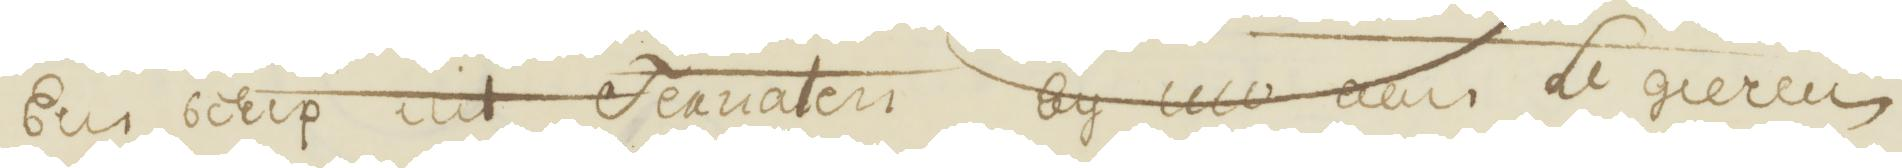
Een schip uit Ternaten by uw aan te gieren
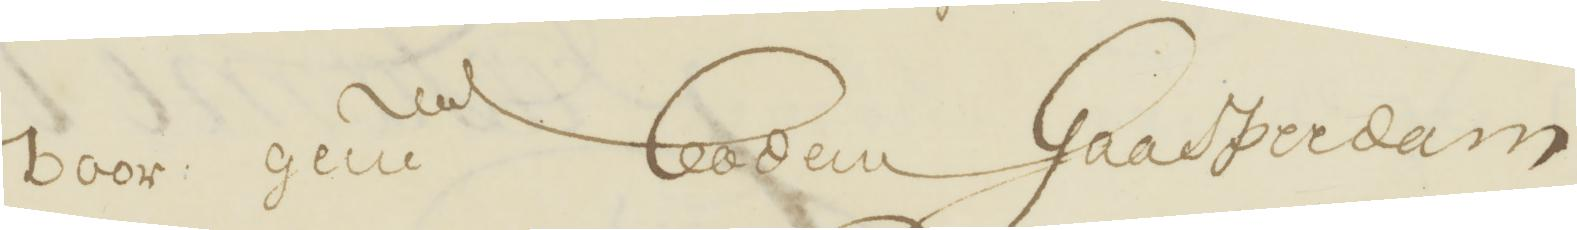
voor: gem bodem Gaasperdam
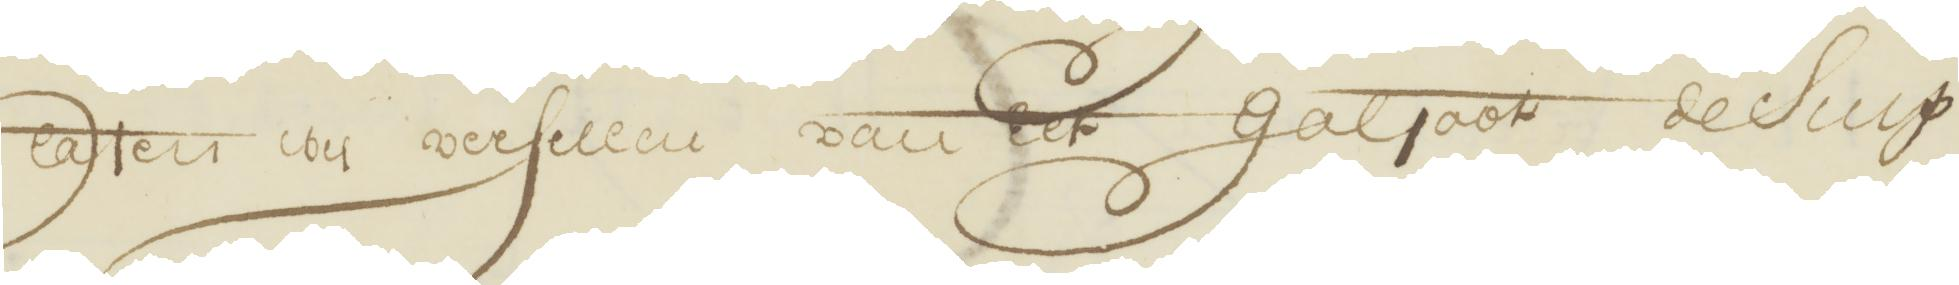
laten wij versellen van het galjoot de snip
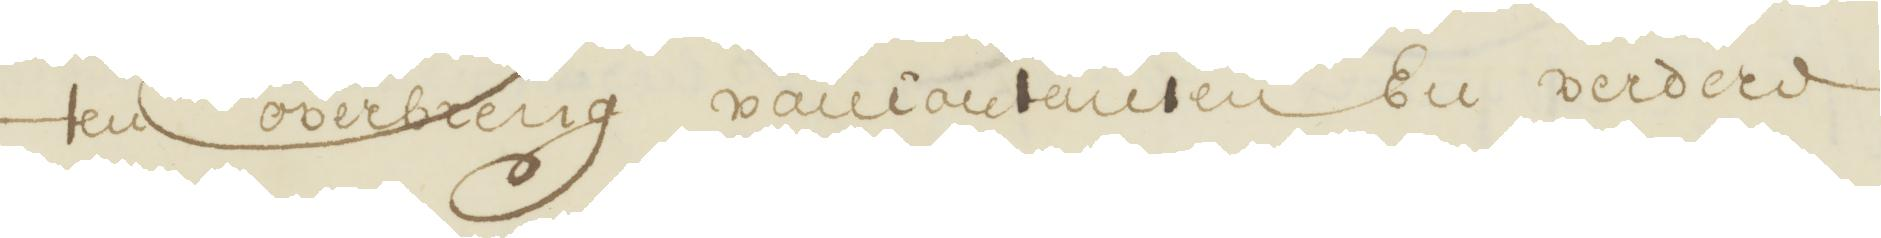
ten overbreng van contanten En verdere
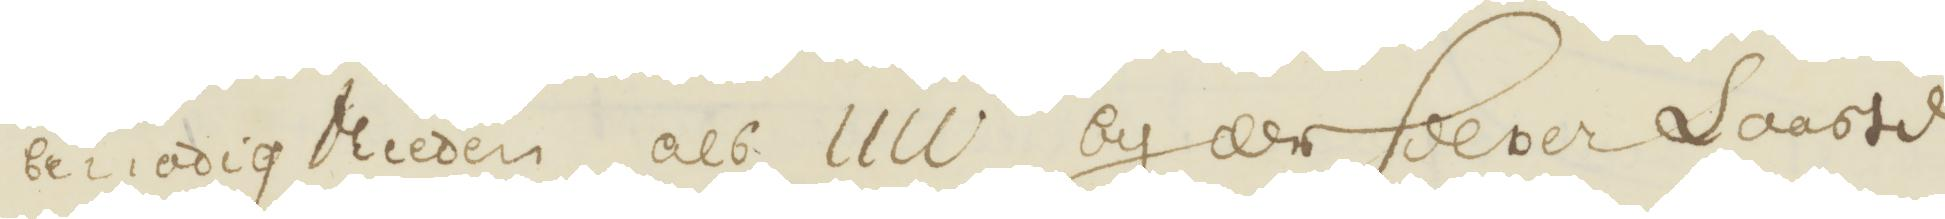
benodigtheeden als UW by derselver Laaste
